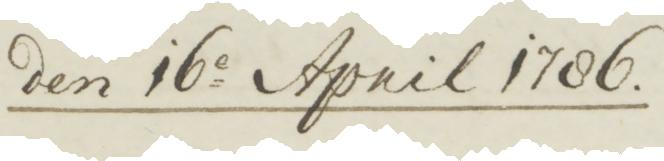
den 16=e April 1786.
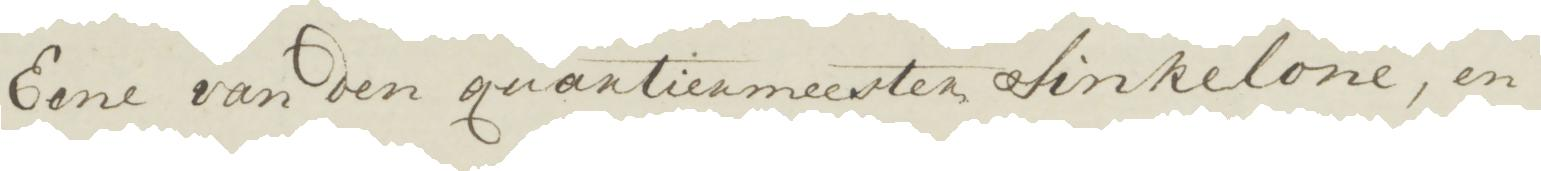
Eene van den quartiermeester sinkelone, en
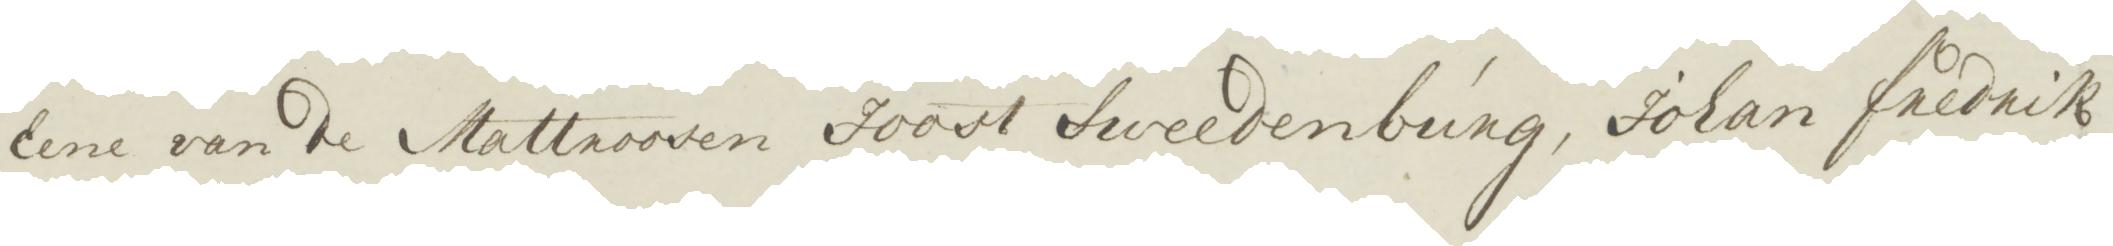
Eene van de Mattroosen Ioost sweedenburg, Iohan fredrik
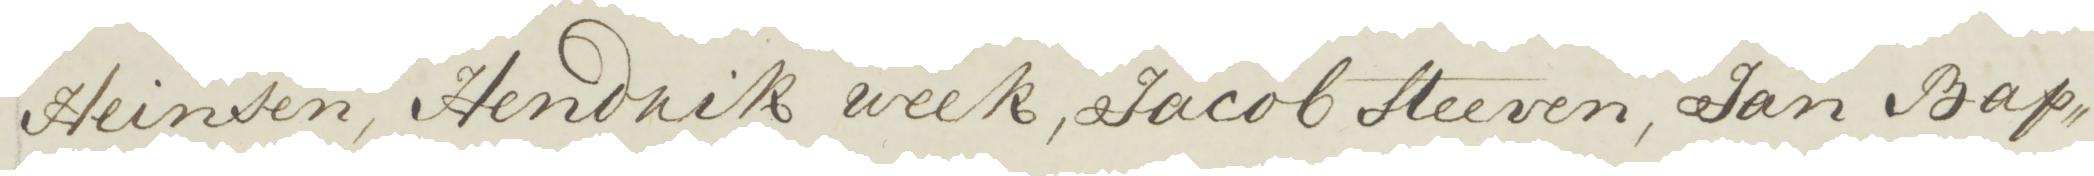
Heinsen, Hendrik week, Iacob steeven, Ian Bap„
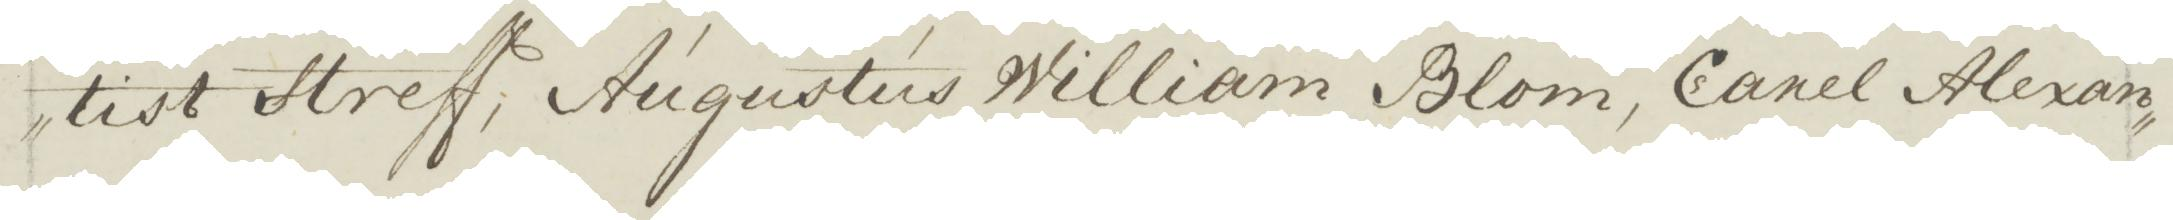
„tist streff; Augustus William Blom, Carel Alexan„
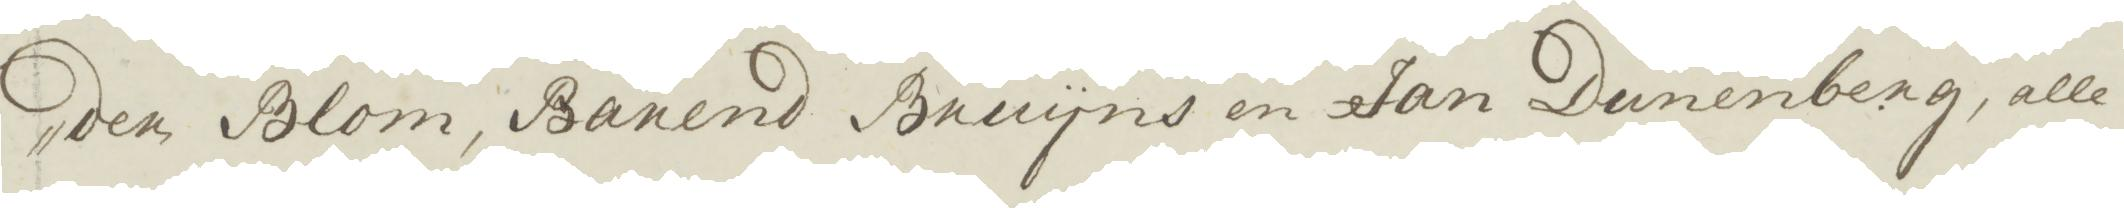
„der Blom, Barend Bruijns en Ian Dunenberg, alle
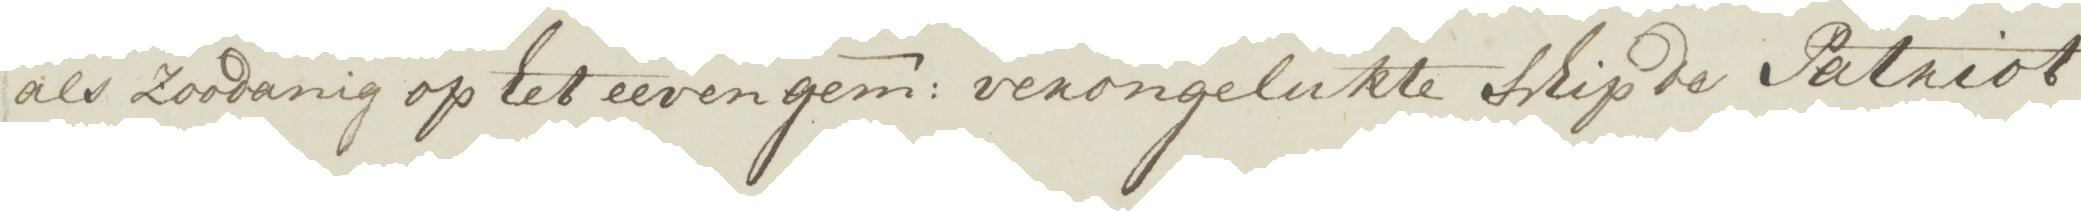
als zoodanig op het eeven gem: verongelukte schip de Patriot
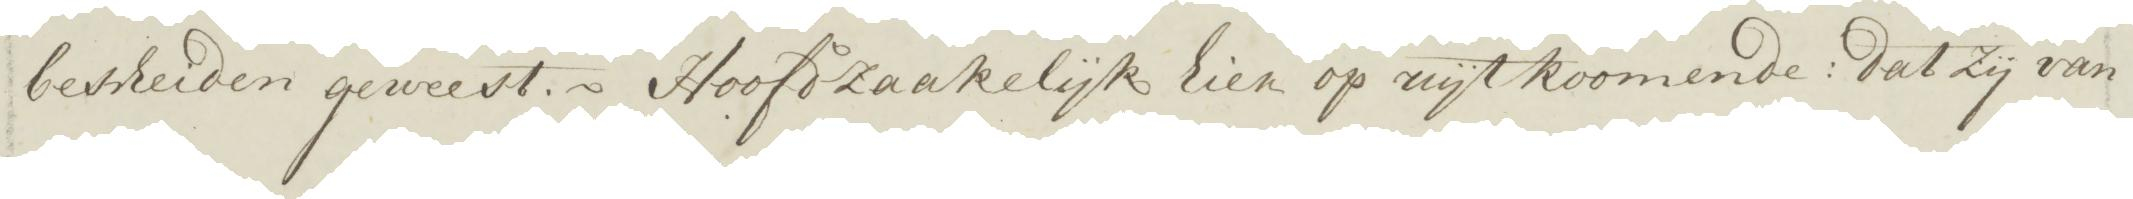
bescheiden geweest. Hoofdzaakelijk hier op uijtkoomende: dat zij van
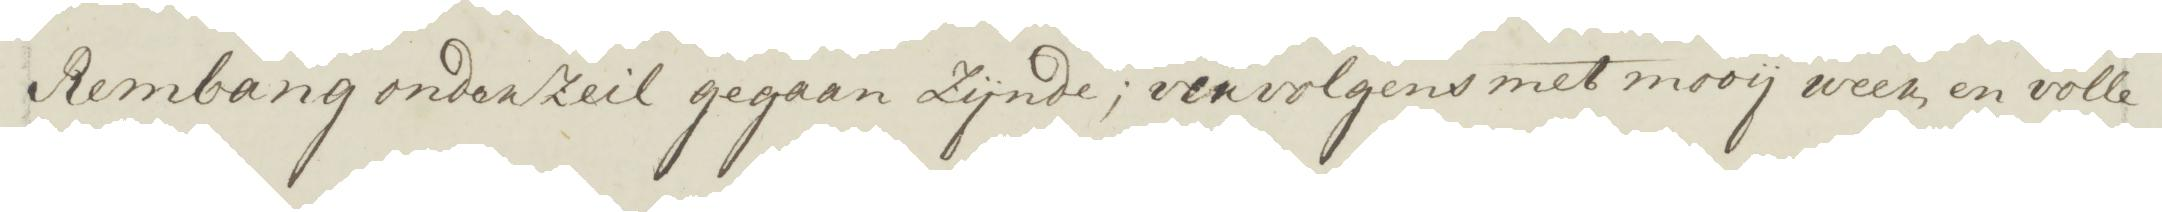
Rembang onderzeil gegaan zijnde; vervolgens met mooij weer en volle
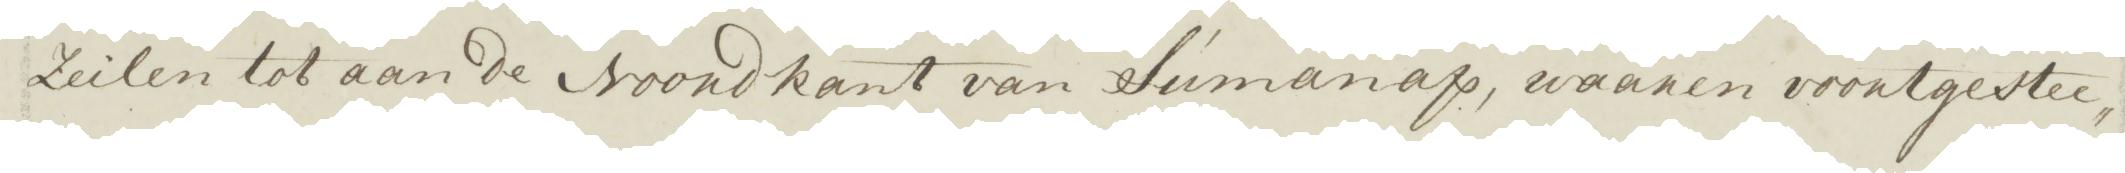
zeilen tot aan de Noordkant van sumanap, waaren voortgestee„
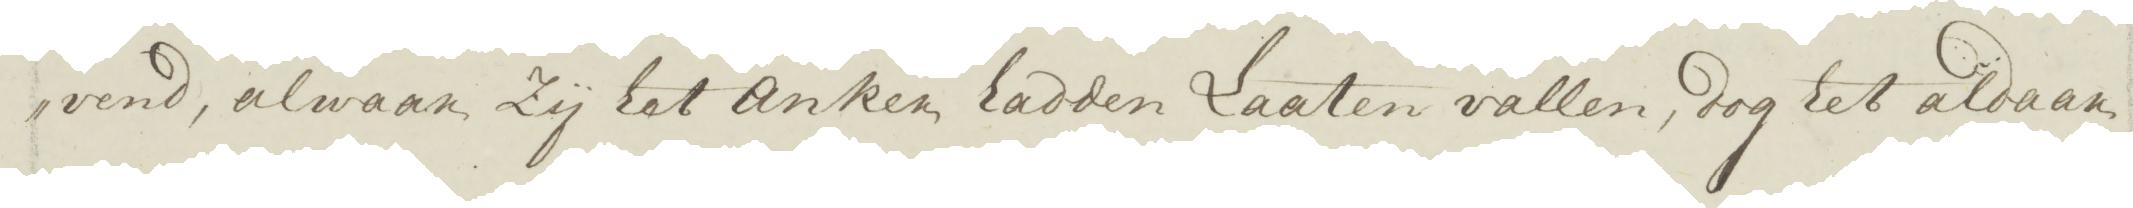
„vend, alwaar zij het anker hadden laaten vallen, dog het aldaar
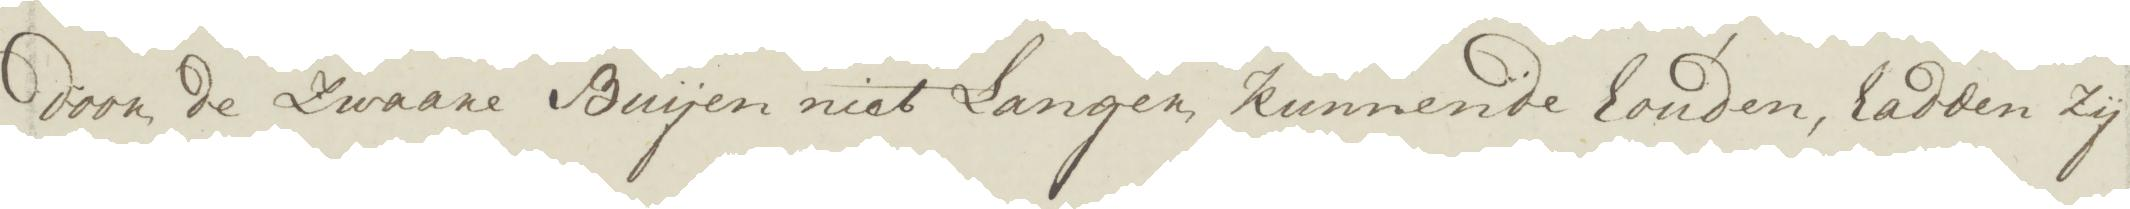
door de zwaare Buijen niet langer kunnende houden, hadden zij
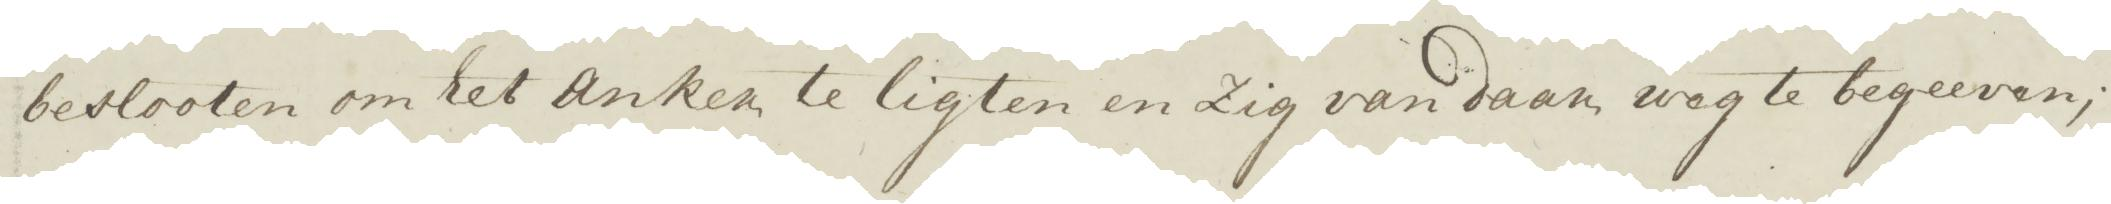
beslooten om het anker te ligten en zig van daar weg te begeeven;
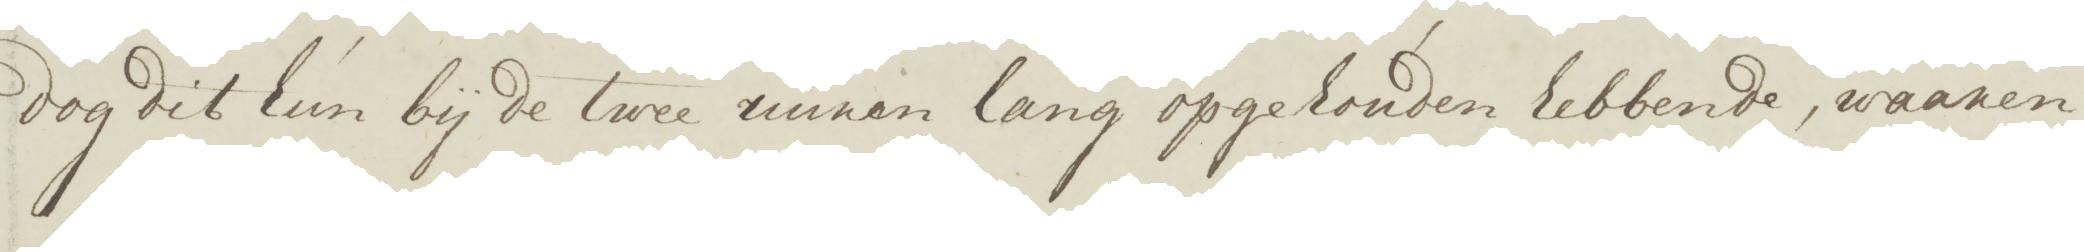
dog dit hun bij de twee uuren lang opgehouden hebbende, waaren
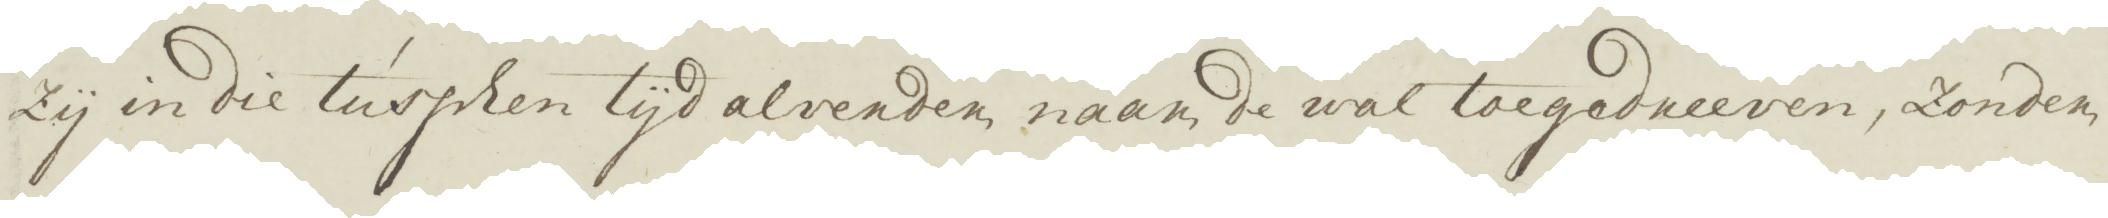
zij in die tusschen tijd alverder naar de wal toegedreeven, zonder
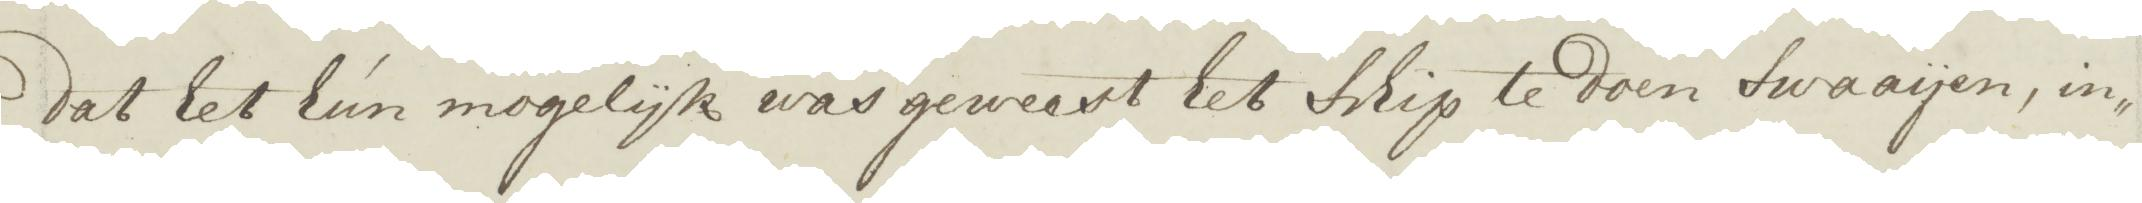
dat het hun mogelijk was geweest het schip te doen swaaijen, in„
